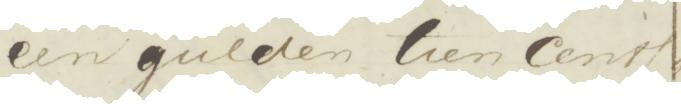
een gulden tien cents
